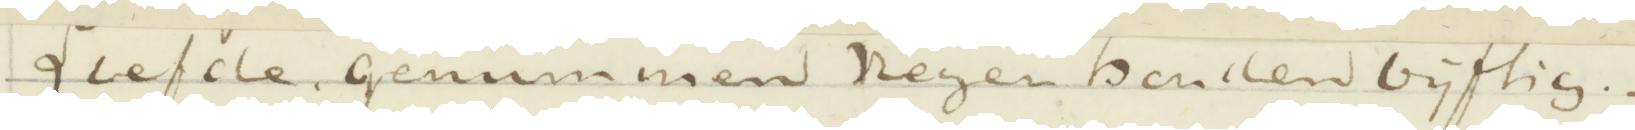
Liefde genummerd Negen honderd vijftig.
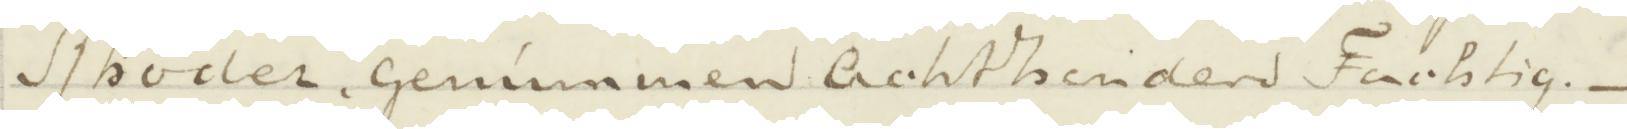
Rhodez genummerd Achthonderd Tachtig.-
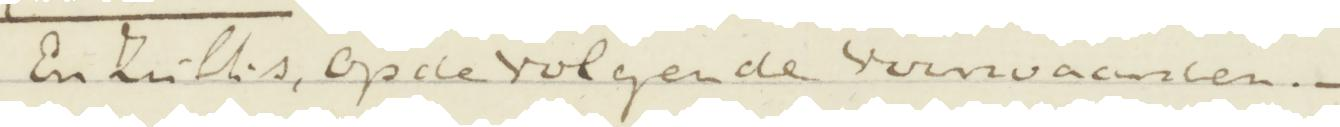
En Zulks op de volgende voorwaarden.
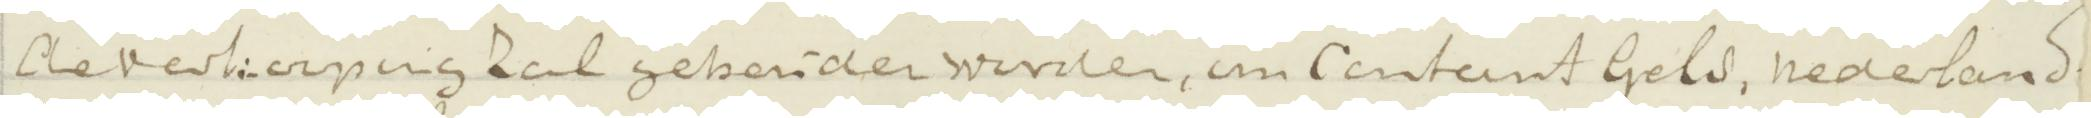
de verkooping zal gehouden worden, in Contant geld, nederland
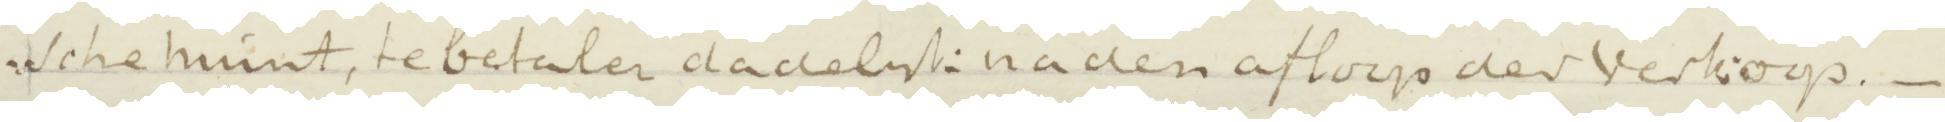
„sche munt, te betalen dadelijk na den afloop der Verkoop. —
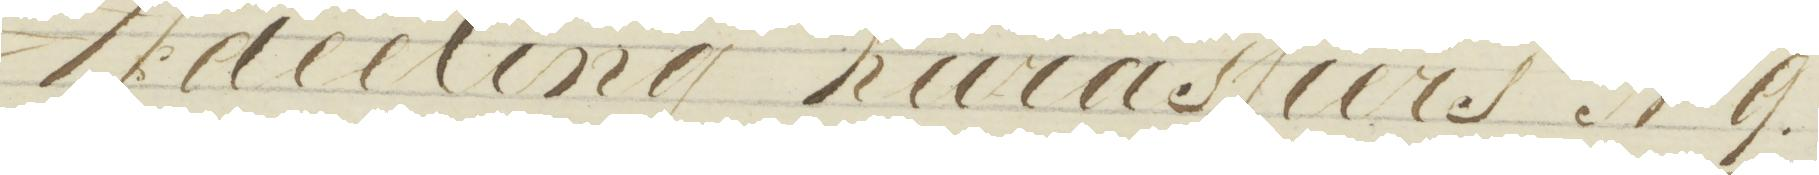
Afdeeling kurassiers N=o 9.
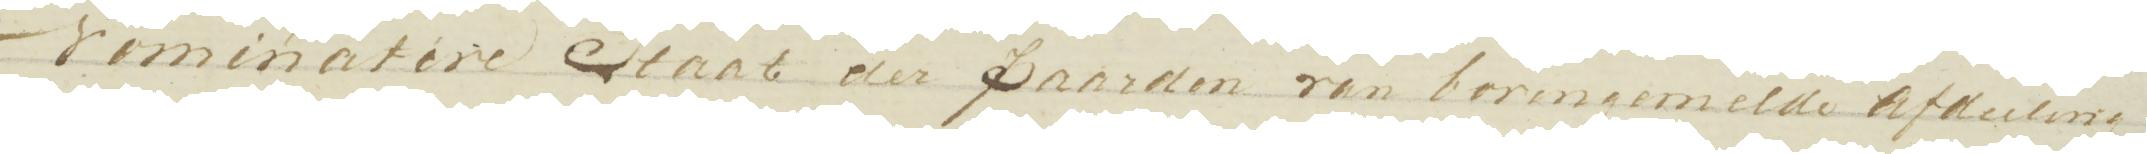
Nominative staat der Paarden van bovengemelde afdeeling
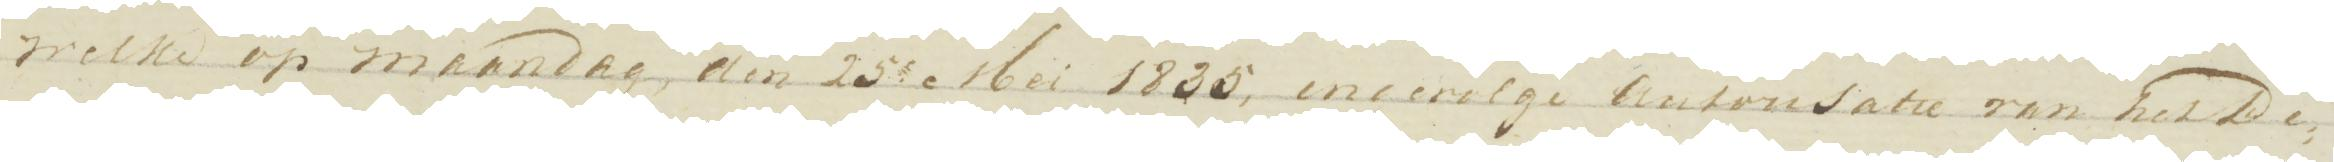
welke op maandag den 25te Mei 1835, ingevolge autorisatie van het De„
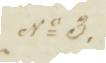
N:o 3.
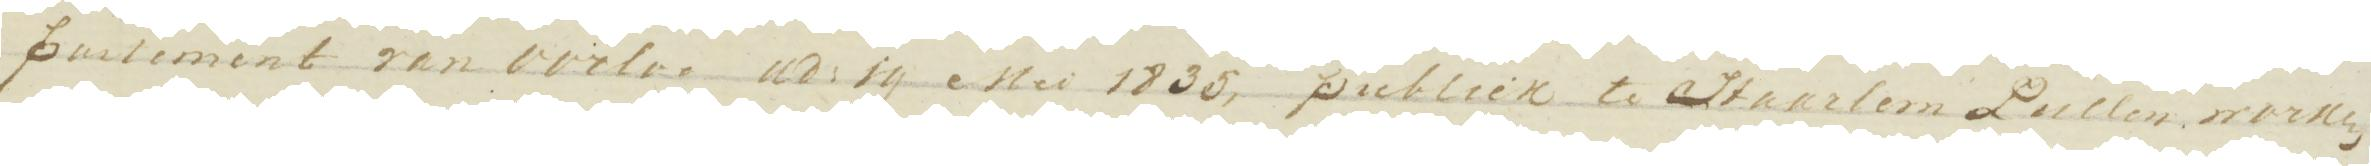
partement van oorlog, ad: 19 Mei 1835, publiek te Haarlem zullen worden
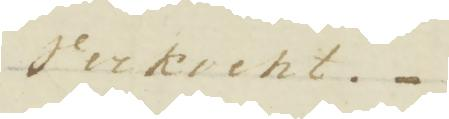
verkocht.
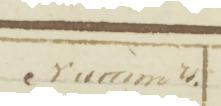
Numm.rs
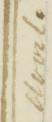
doorlo
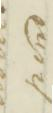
pend
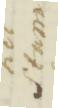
Stam
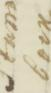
boek
